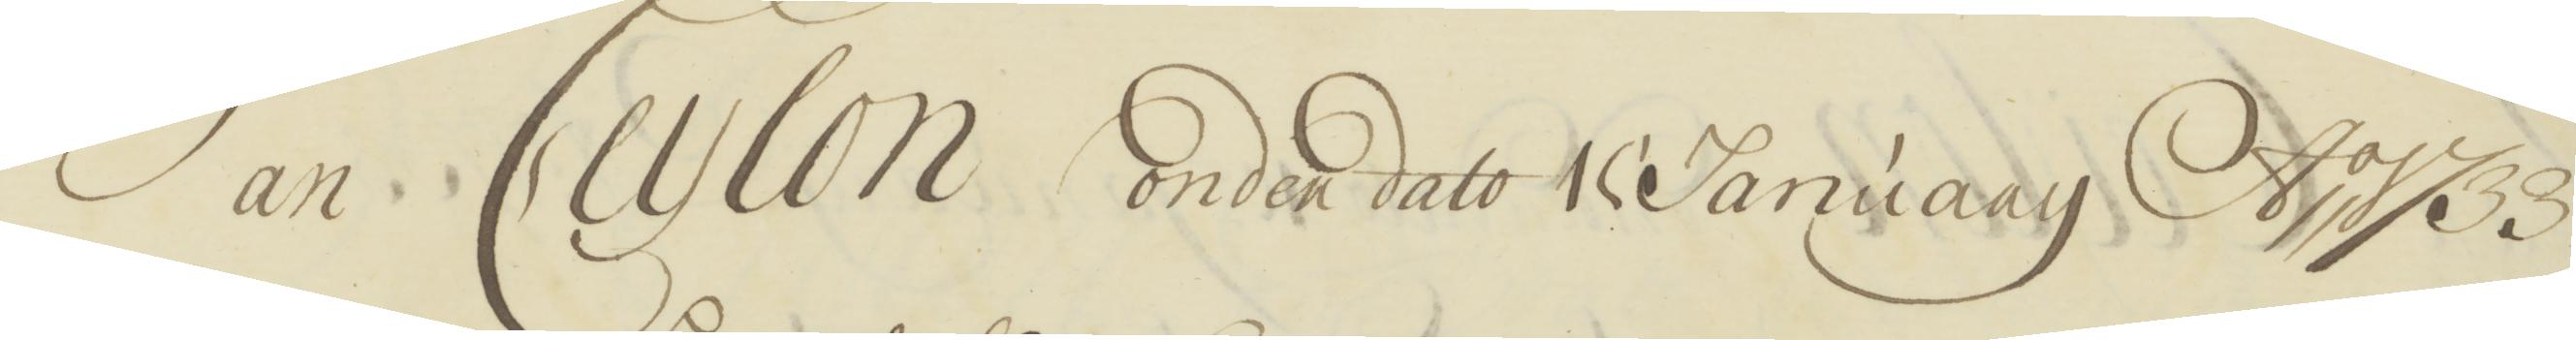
Van Ceijlon onder dato 15' Ianuary A„o 1733
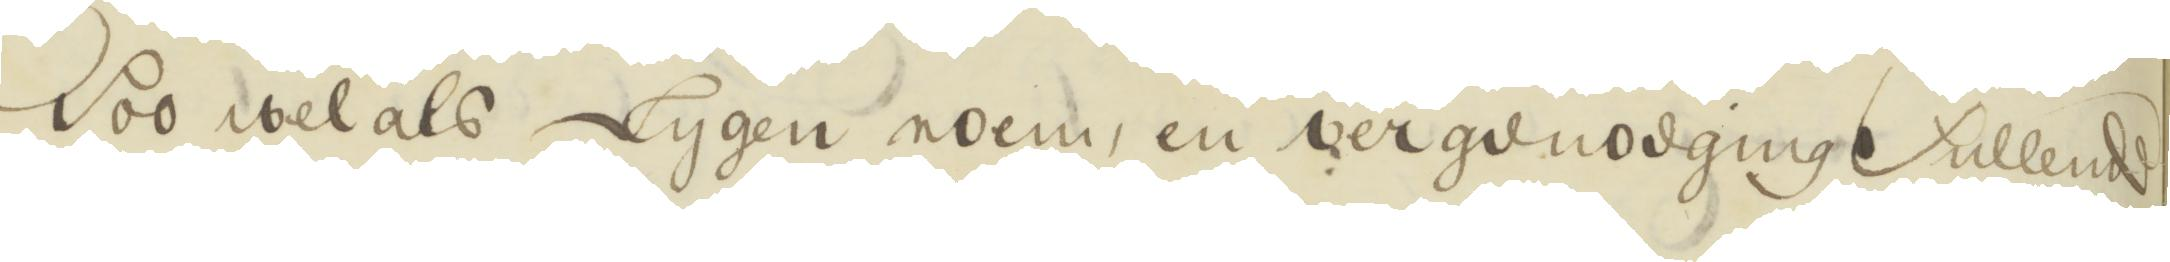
Soo wel als Eygen roem, en vergenoeging Sullende
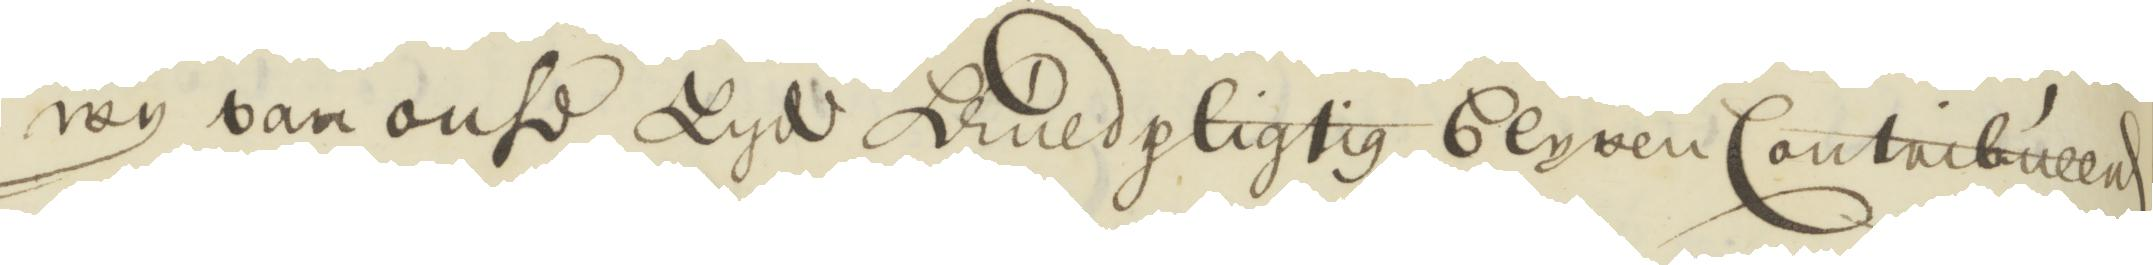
wy van onse Zyde Schuldpligtig blyven Contribueeren
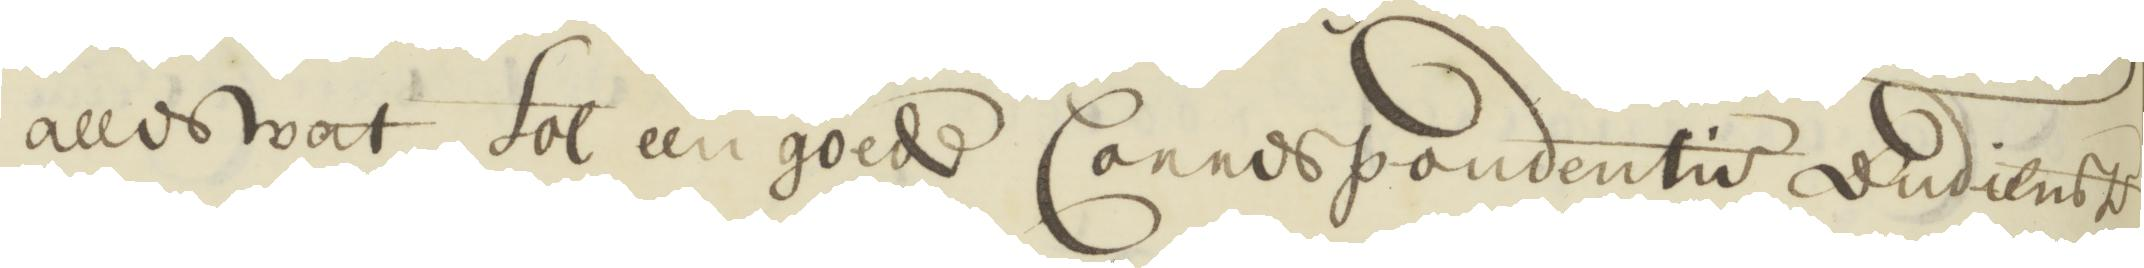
alles wat tot een goede Correspondentie ten dienste
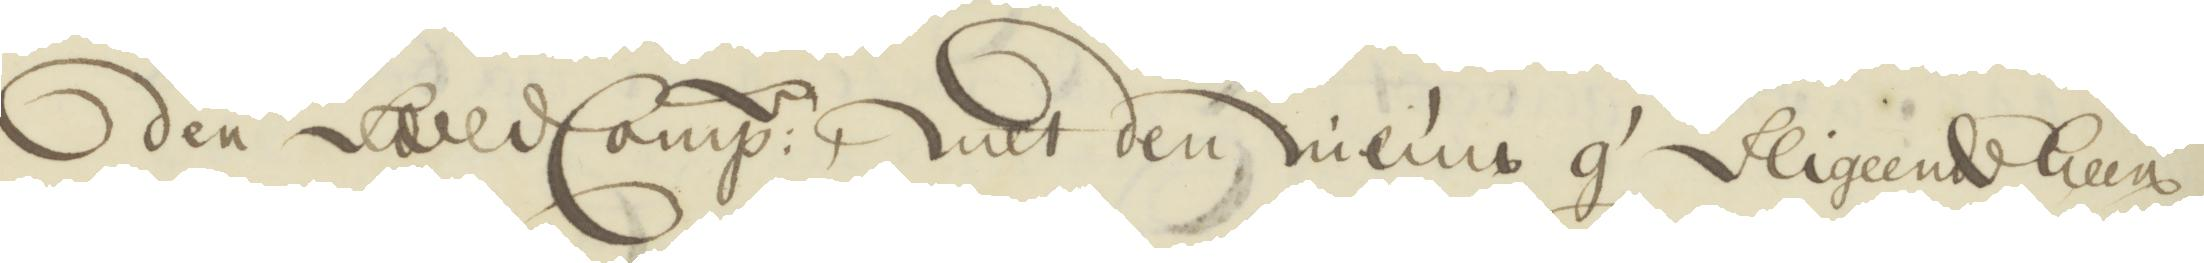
der Edele Comp:e, met den nieuw g’Eligeerde heer
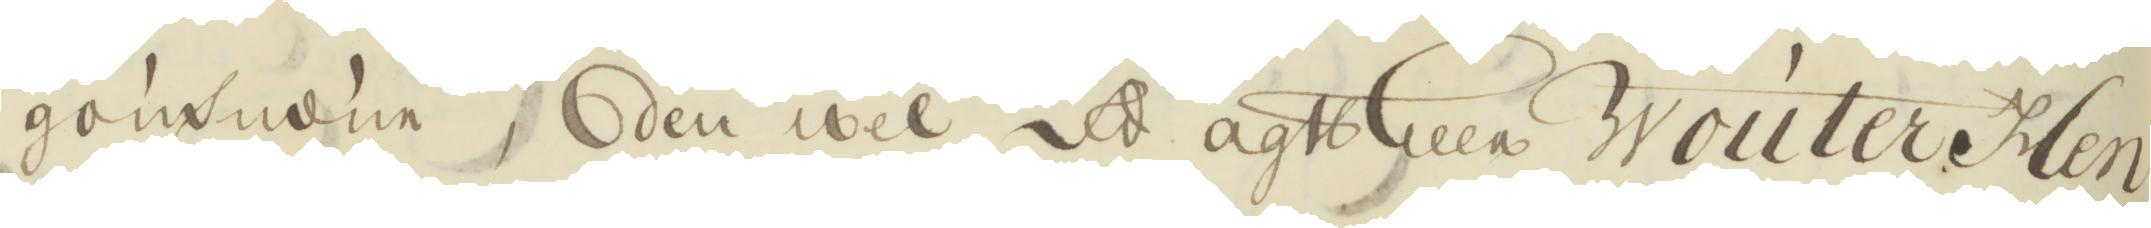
gouverneur, den wel Ed: agtb heer Wouter Hen
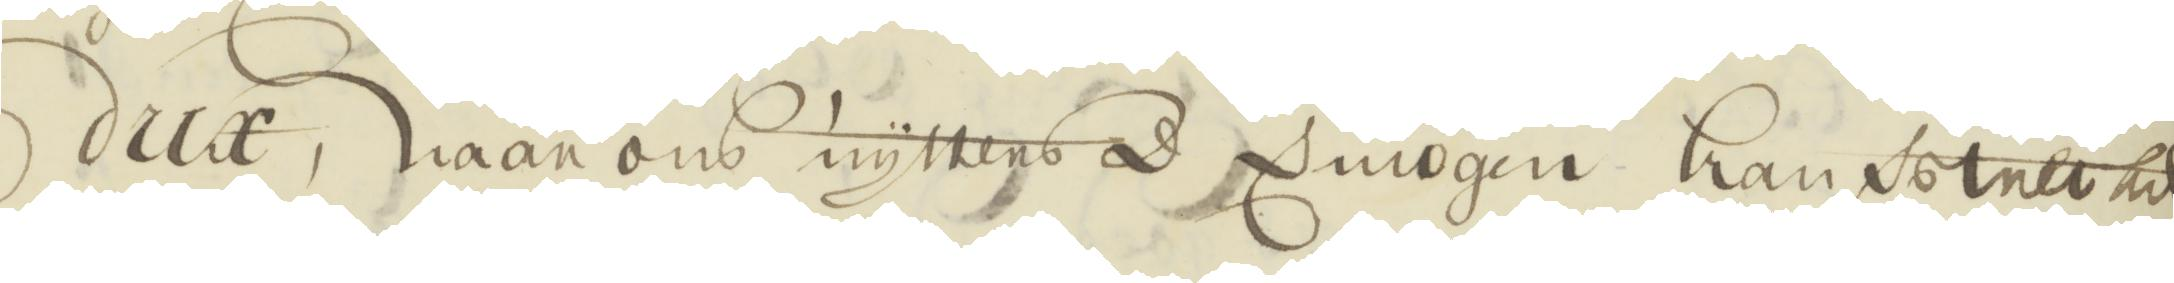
drix, naar ons uijtterste vermogen kan verstrecken
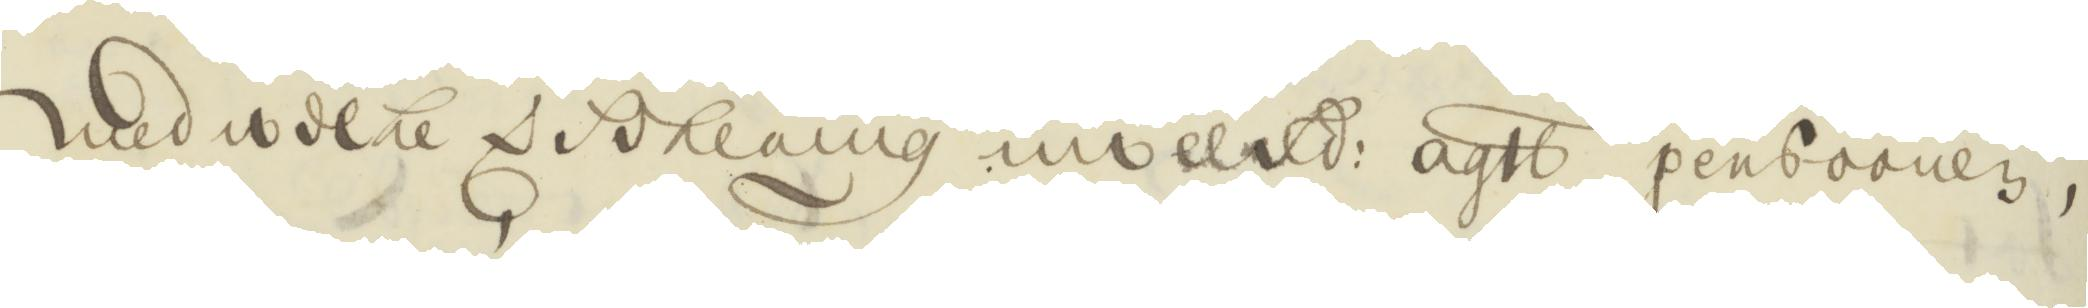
med welke versekering uwel Ed: agtb persoonen,
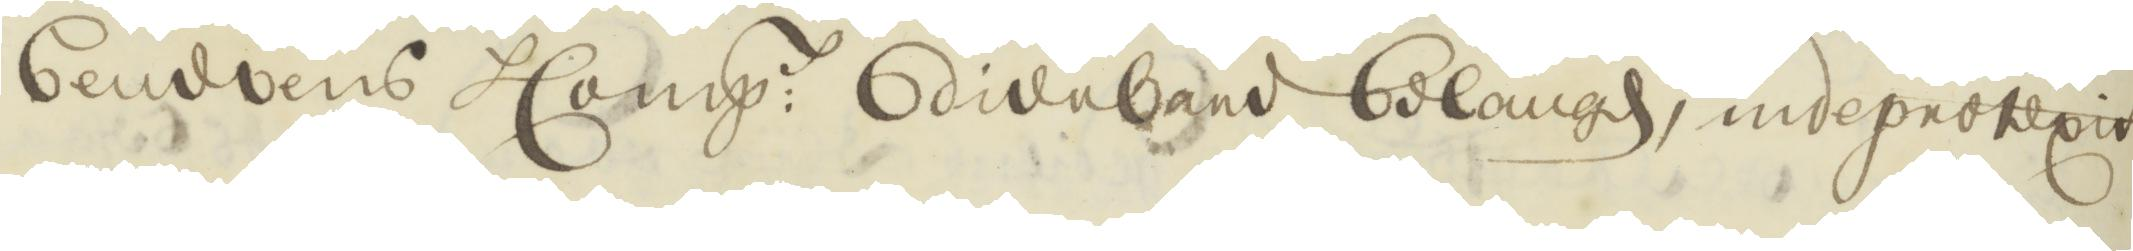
benevens 'sComp:s dierbare belangen, in de protexie
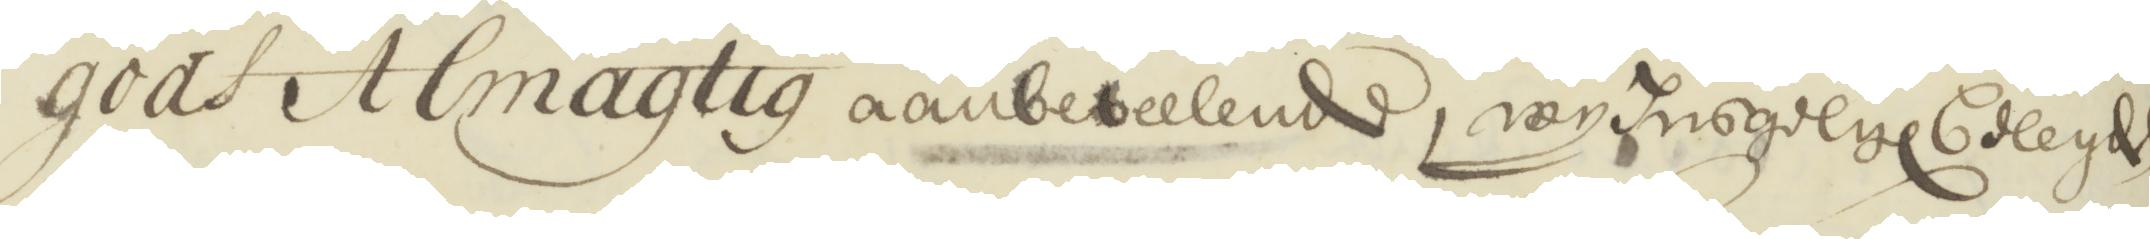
gods Almagtig aanbeveelende, wy Insgelyx beleyden
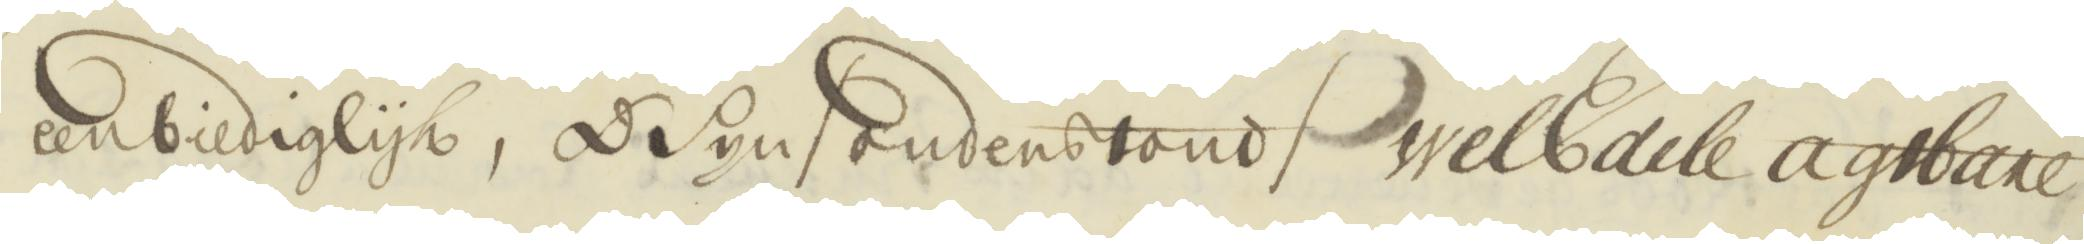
eerbiediglijk, te Syn /onderstond/ wel Edele agtbare
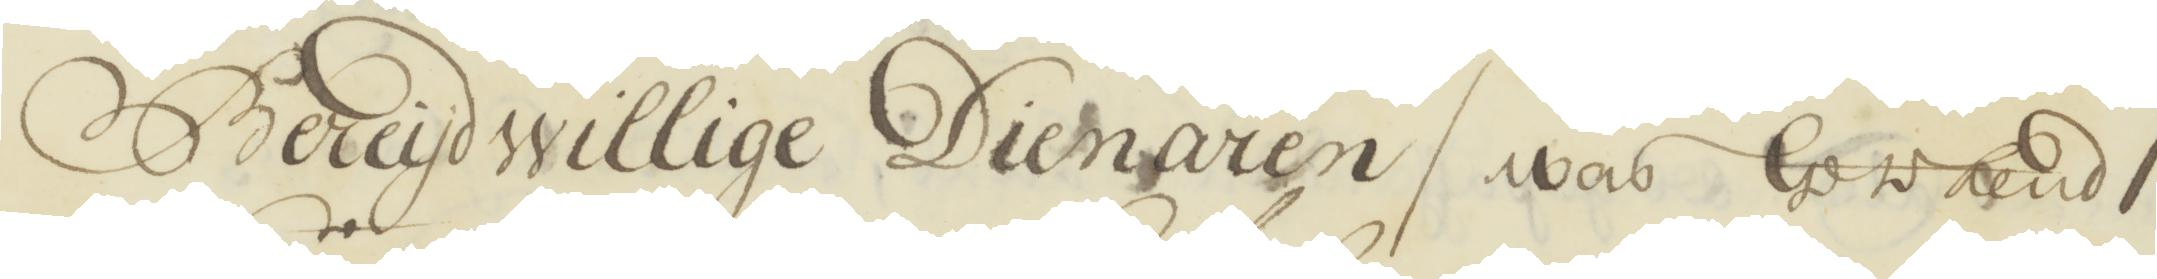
Bereijd willige Dienaren /was getekend/
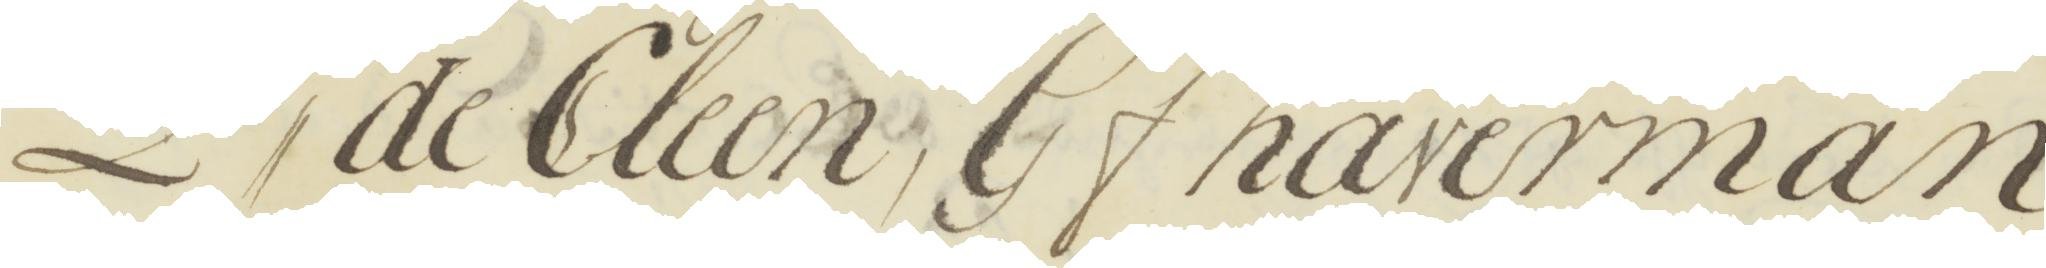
L„t de Cleen, G f haverman
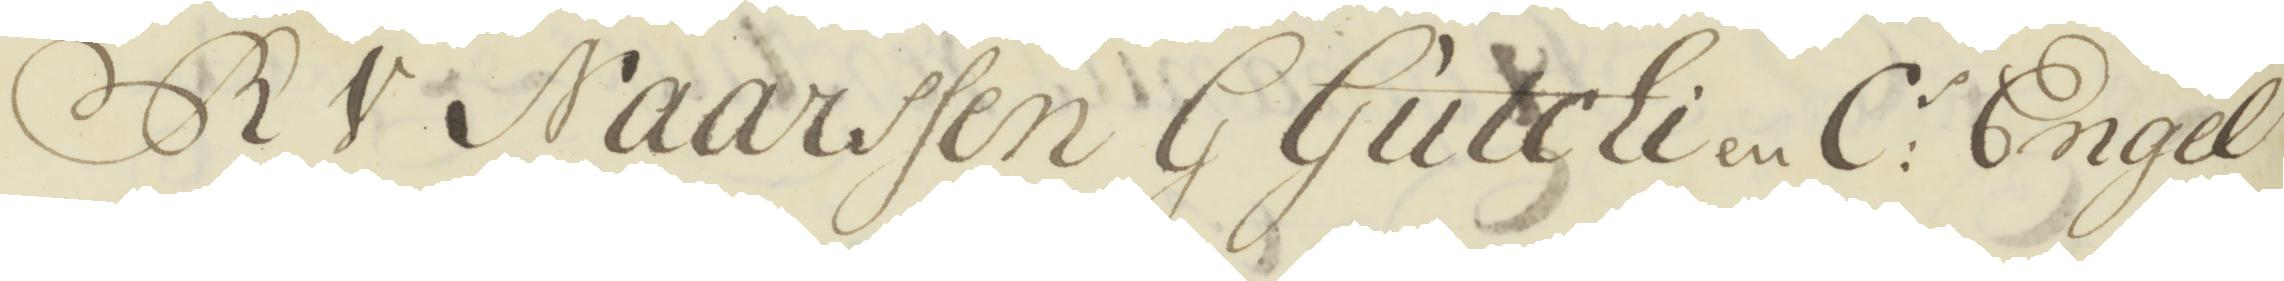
R v: Naarssen G Gutchi en C:s Engel
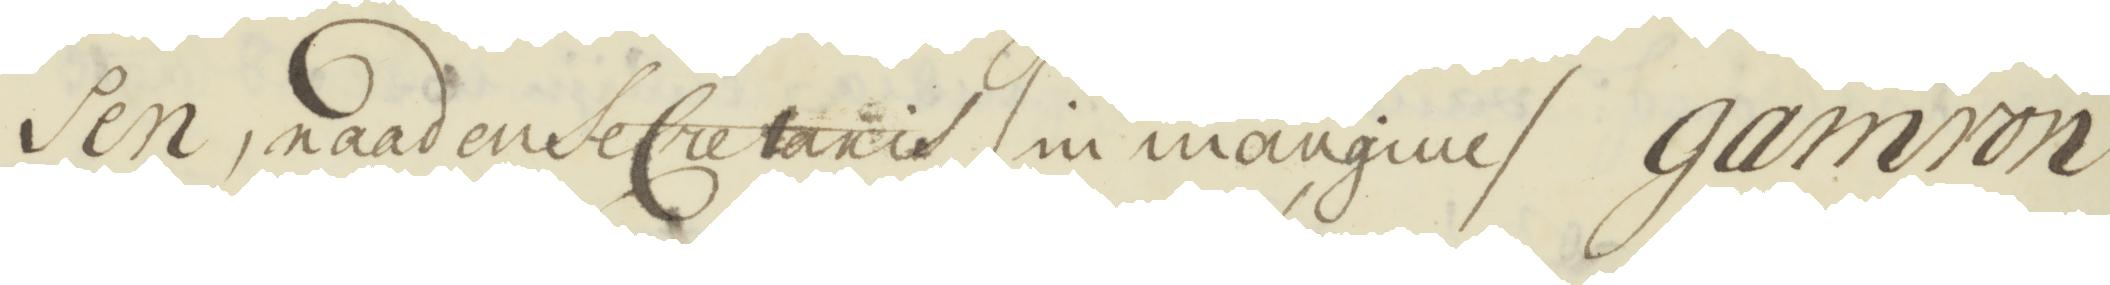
sen, raad en Secretaris / in margine/ gamron
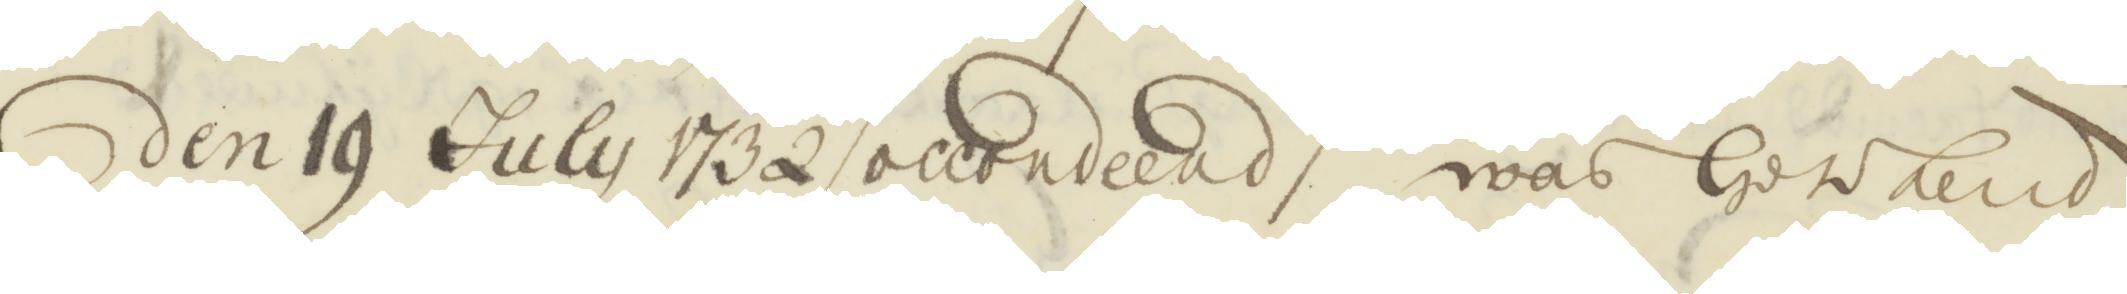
den 19 Iuly 1732 /accordeerd/ was getekend
